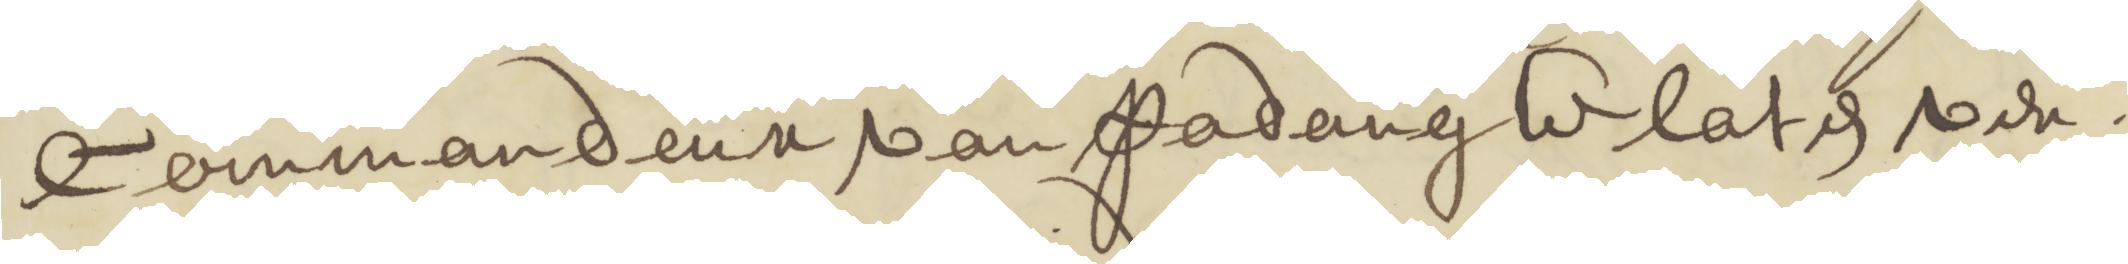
Commandeur van padang te laten ver.
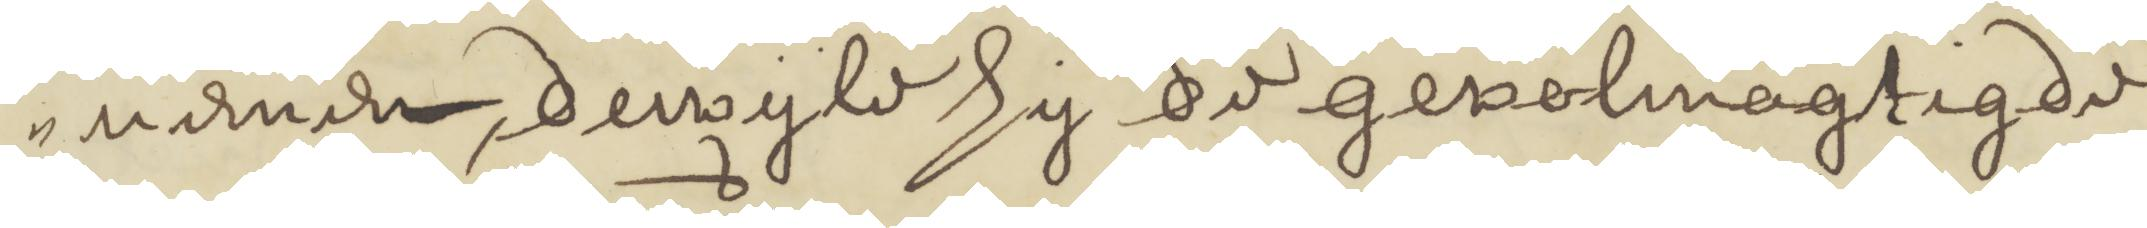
„nemen, dewijle hij de gevolmagtigde
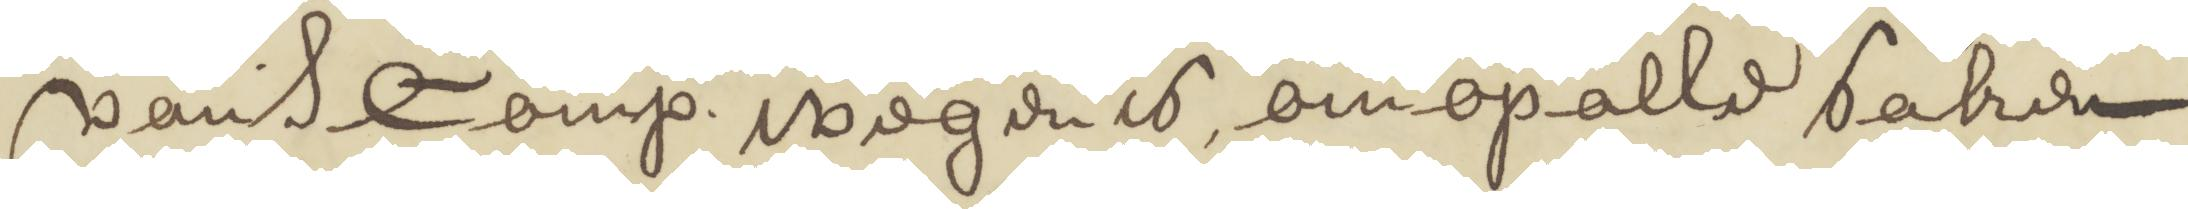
van .S Comp.s wegen is, om op alle saken
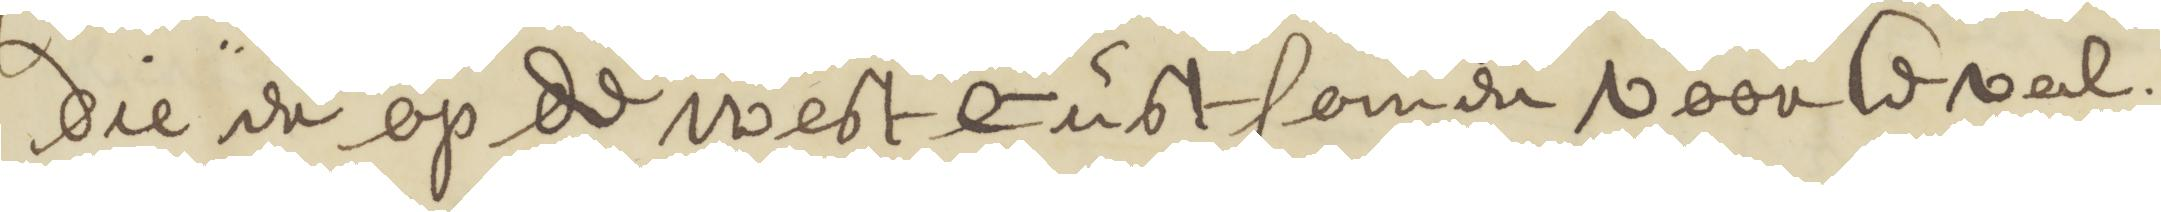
die er op de west cust Comen voor te val.
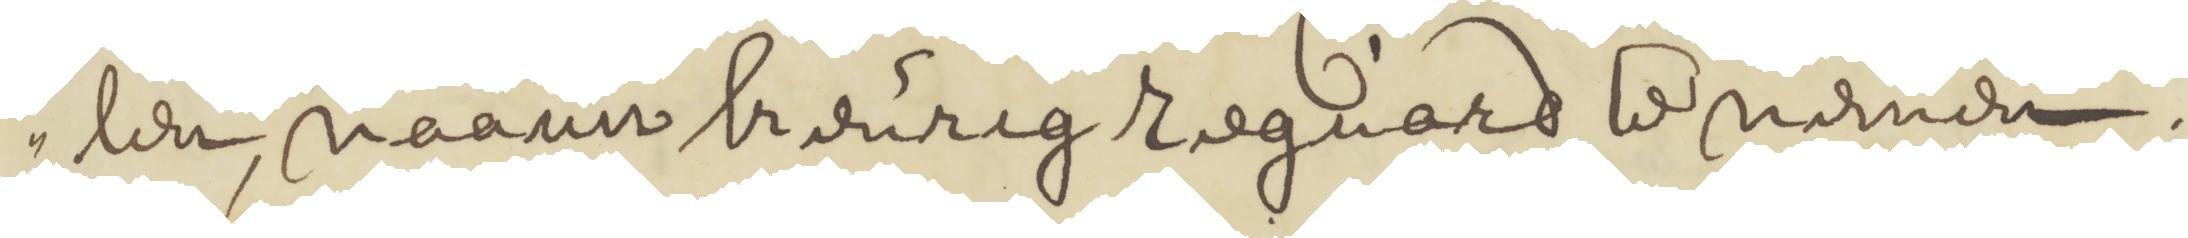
„len, naauw keurig reguard te nemen.
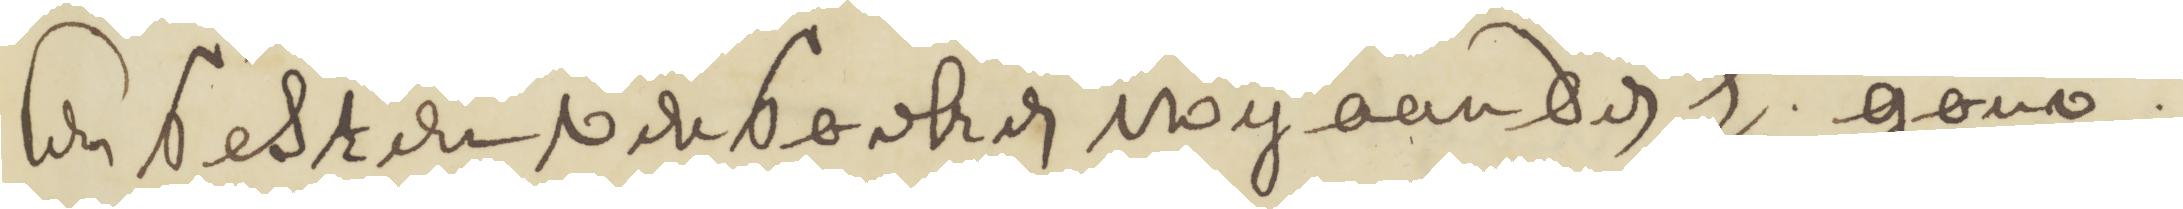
ten sesten versoeken wij aan den h: gouv.
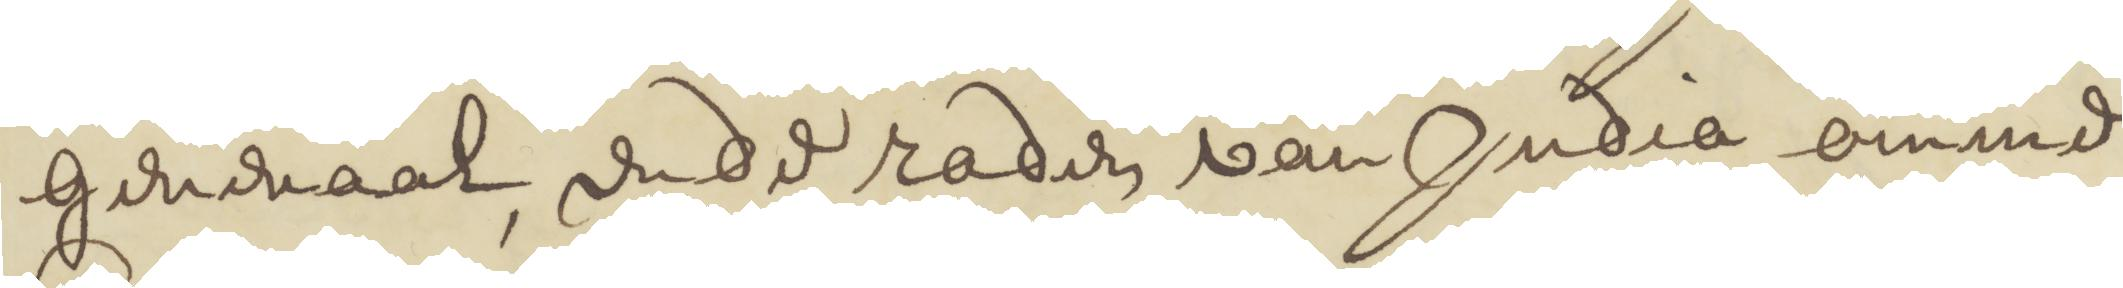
generaal, en de raden van India, omme
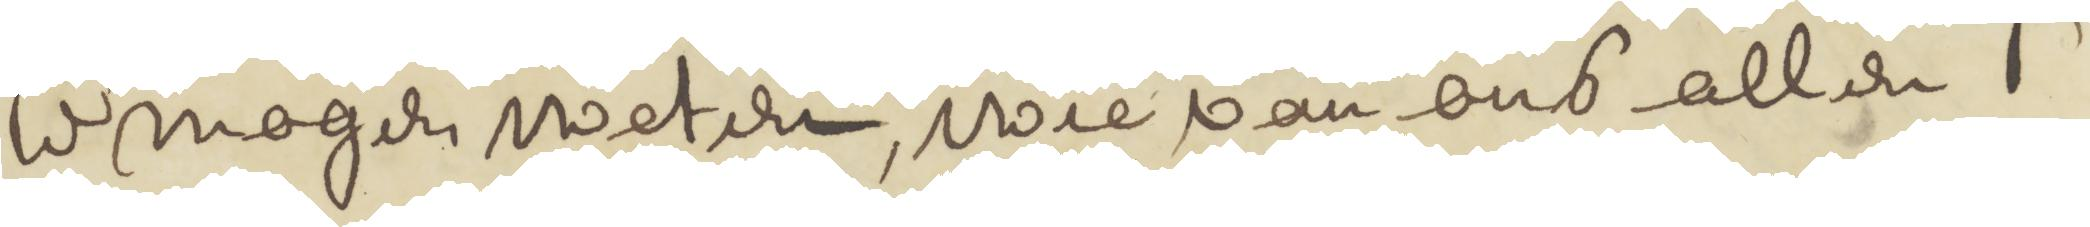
te mogen weten, wie van ons allen 't
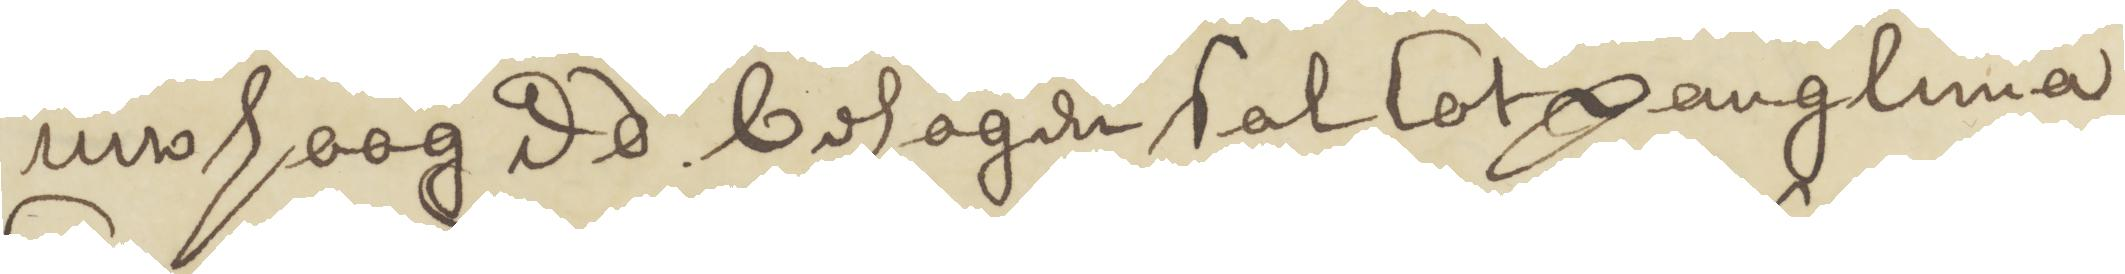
uw hoog Ed. behagen sal tot panglima
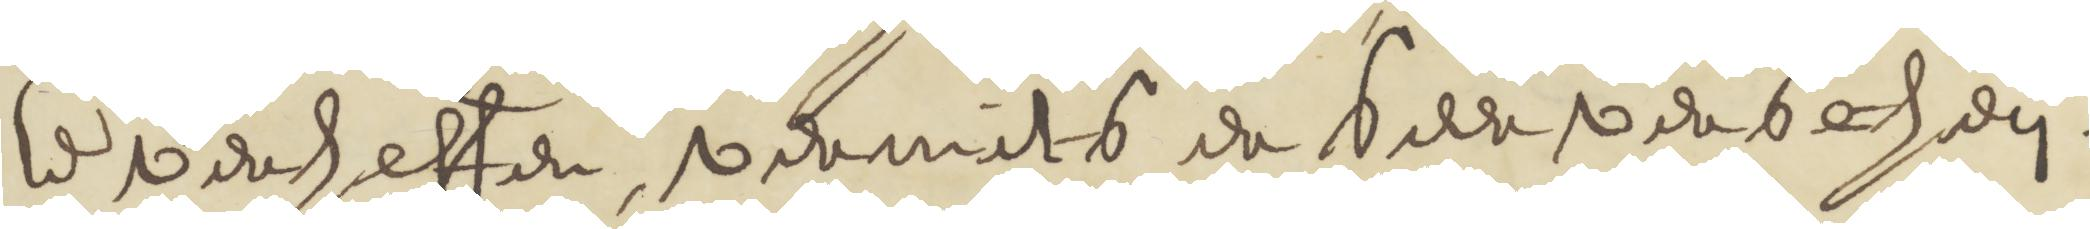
te verheffen ,vermits en seer verschey.
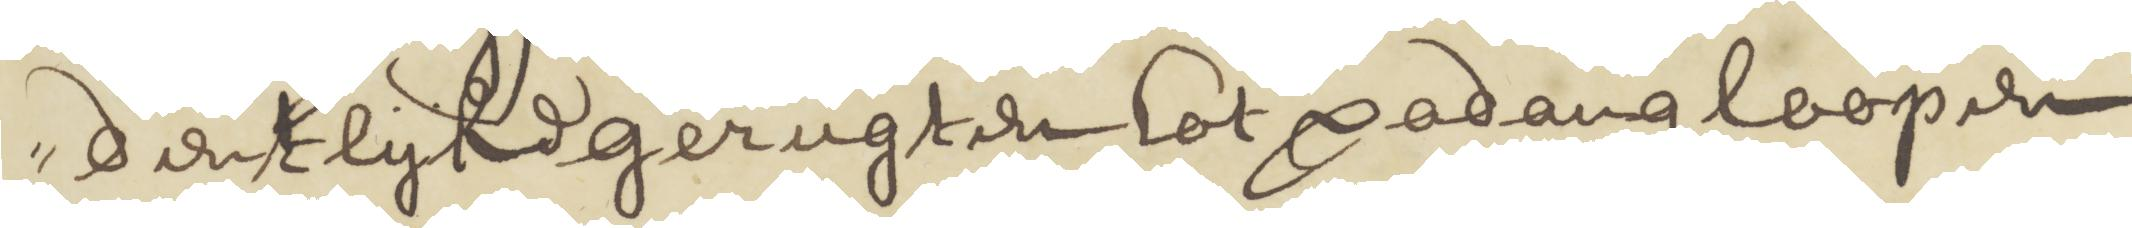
„dentlijke gerugten tot padang loopen
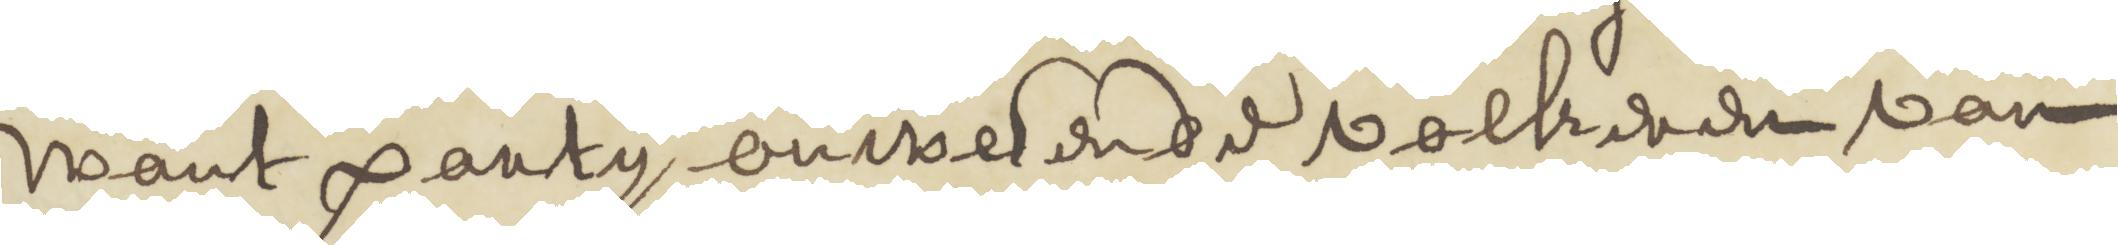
want partij onwetende volkeren van
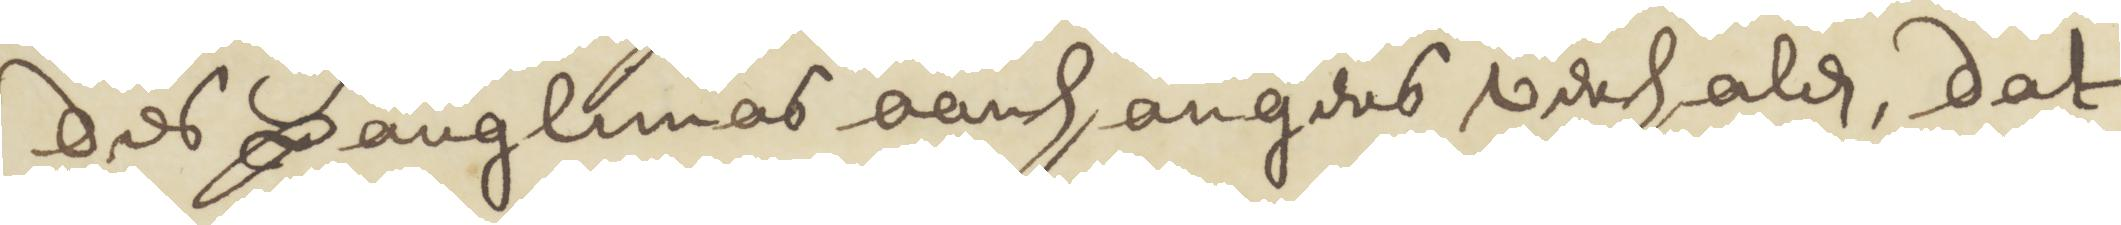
des panglimas aanhangers verhalen, dat
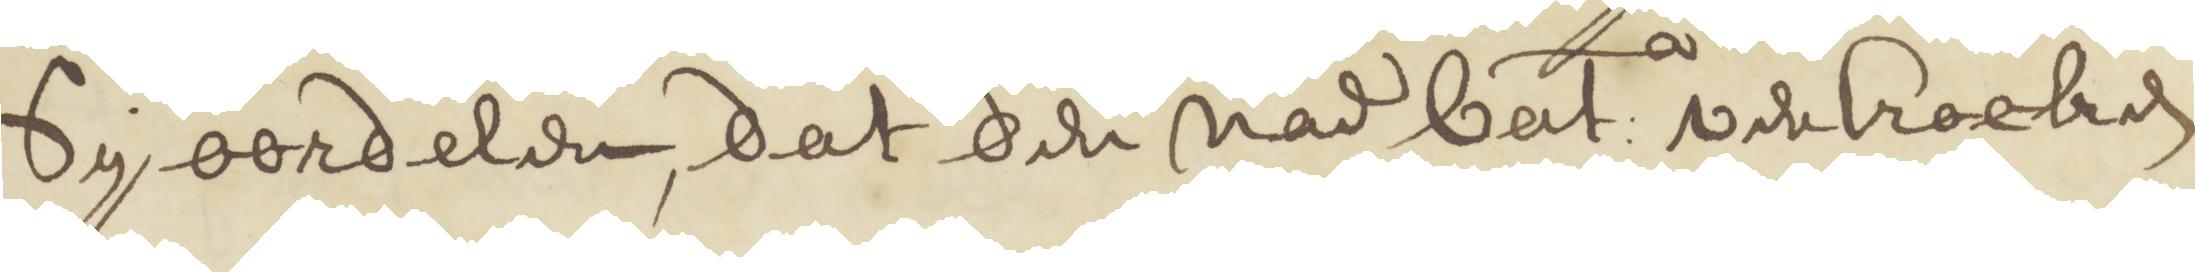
Sij oordelen, dat den nae bat:a vertrocken
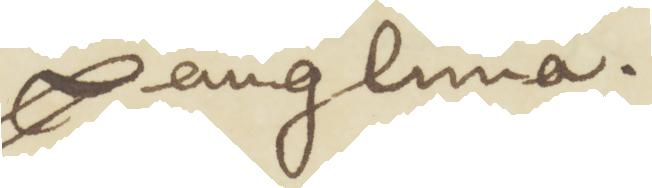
panglima.
